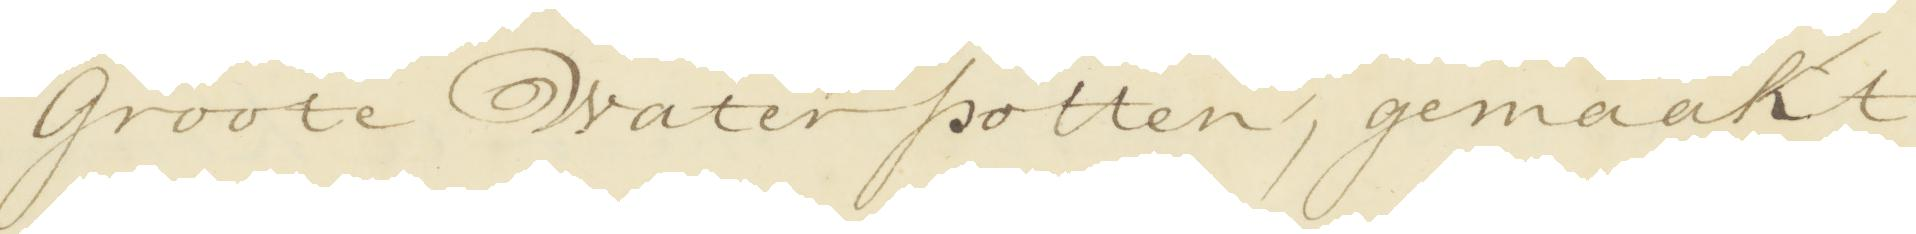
Groote Waterpotten, gemaakt
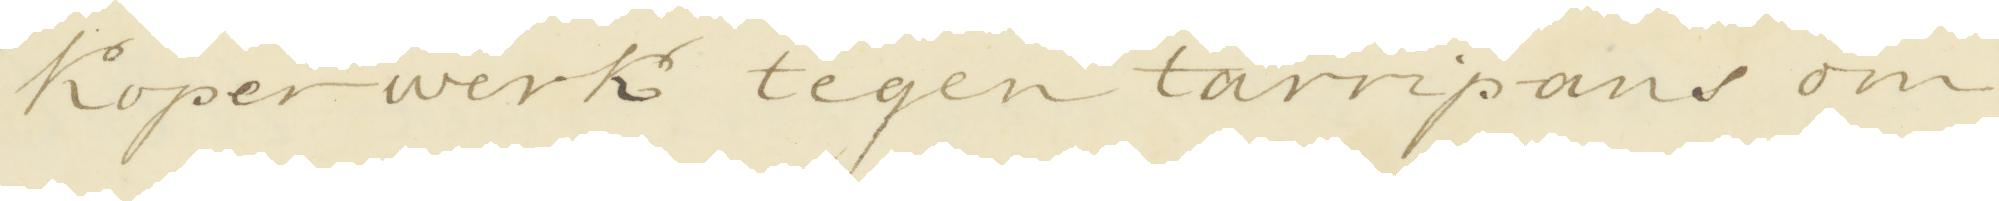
Koperwerk tegen tarripans om
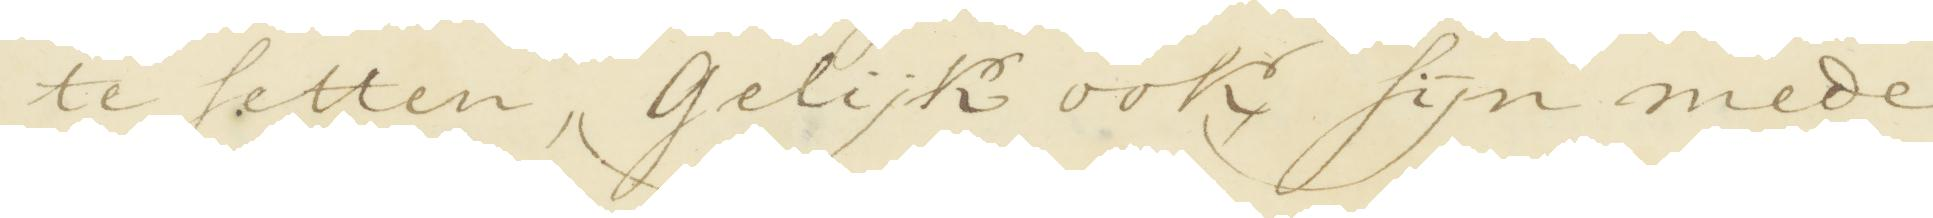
te setten, gelijk ook sijn mede
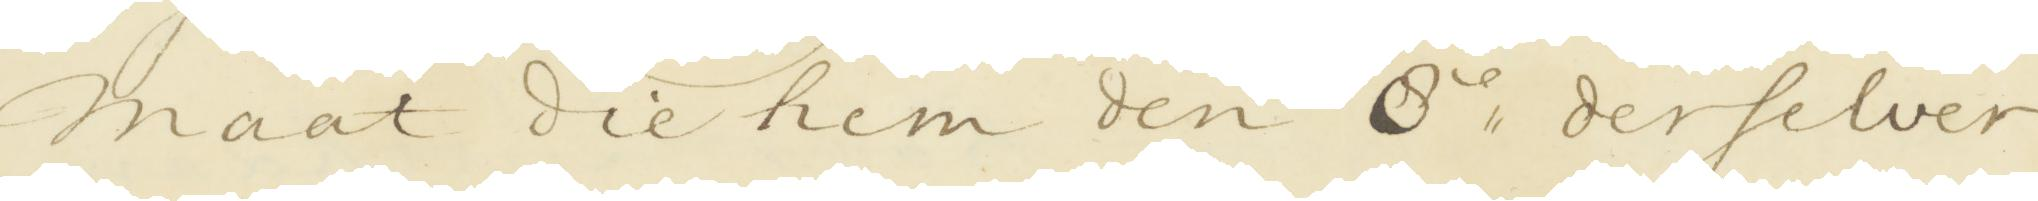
maat die hem den 8„e derselver
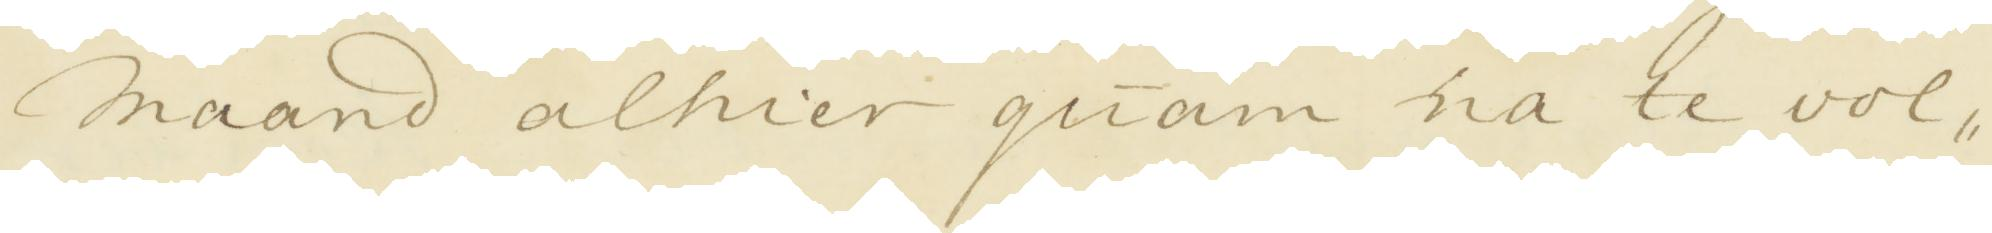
maand alhier quam na te vol„
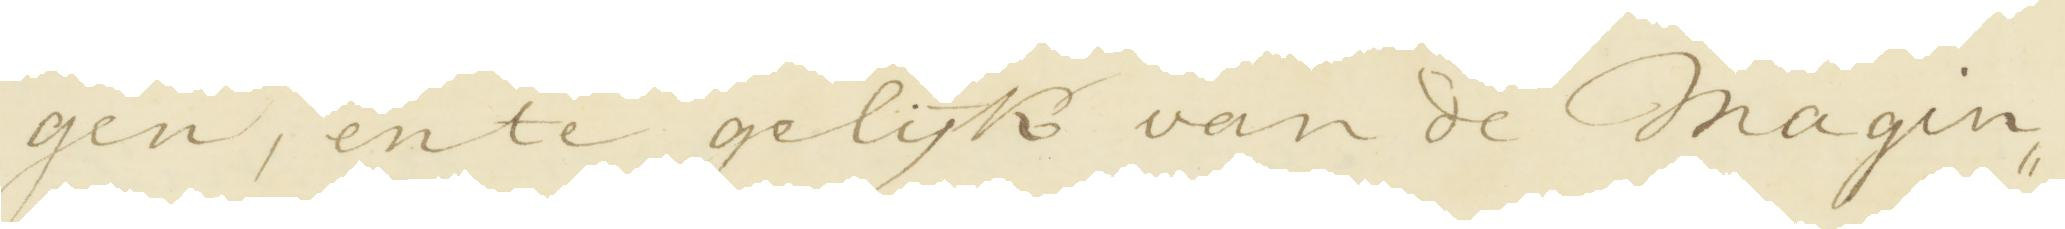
gen, en te gelijk van de magin„
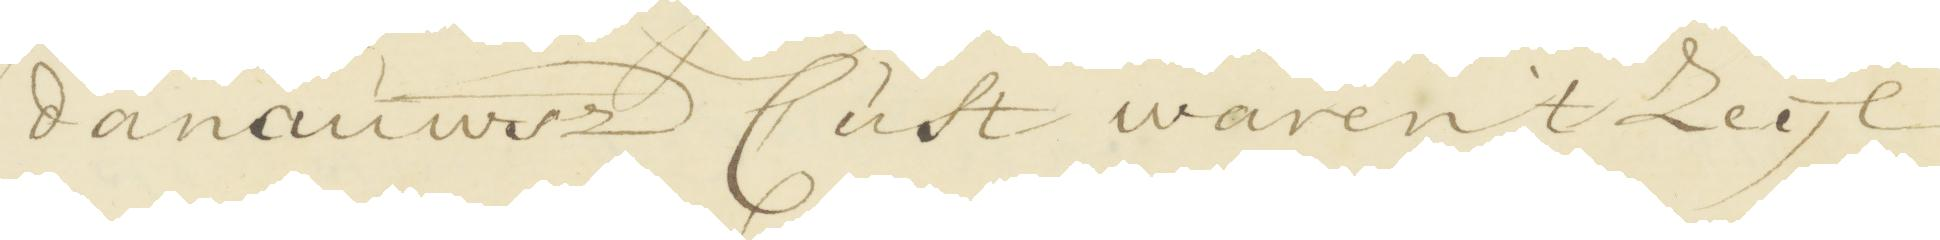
danauwsz Cust waren ’t Zeijl
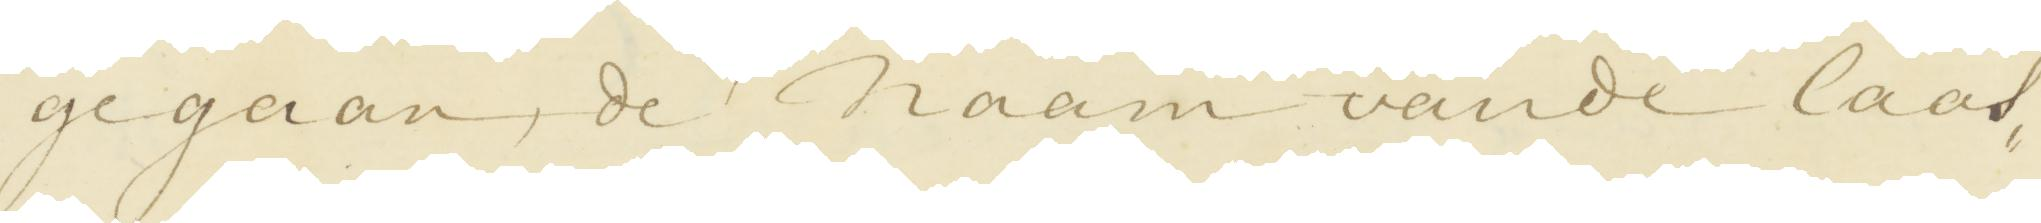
gegaan, de naam vande laas„
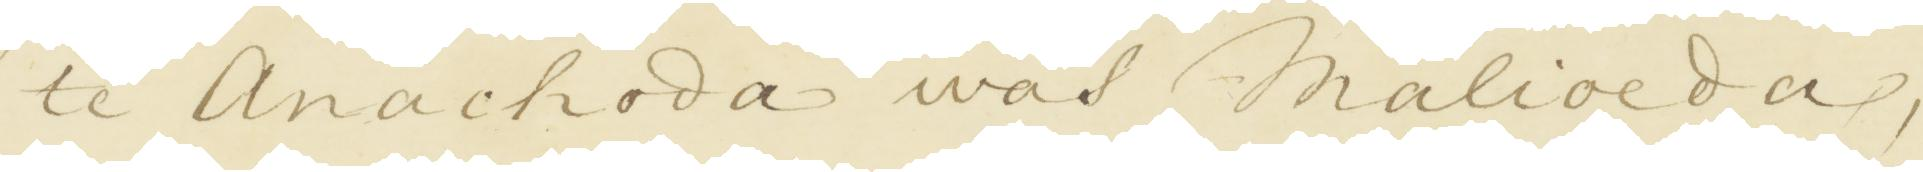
te Anachoda was Malioeda,
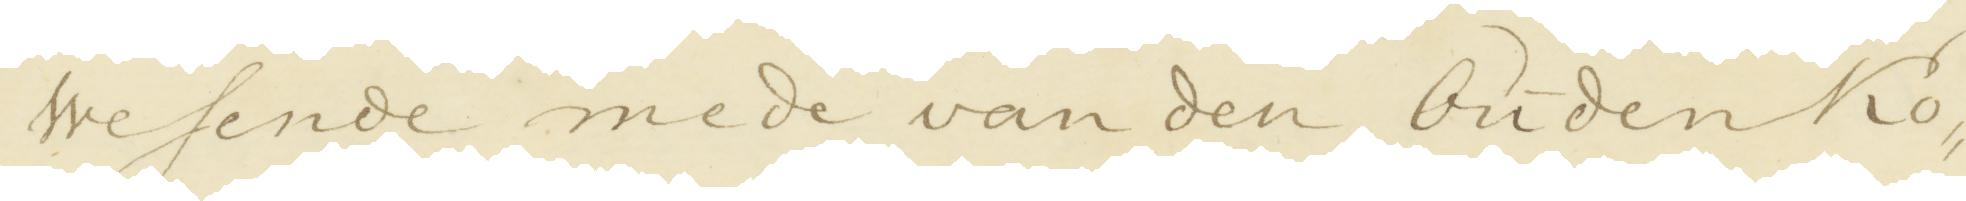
wesende mede van den Ouden Ko„
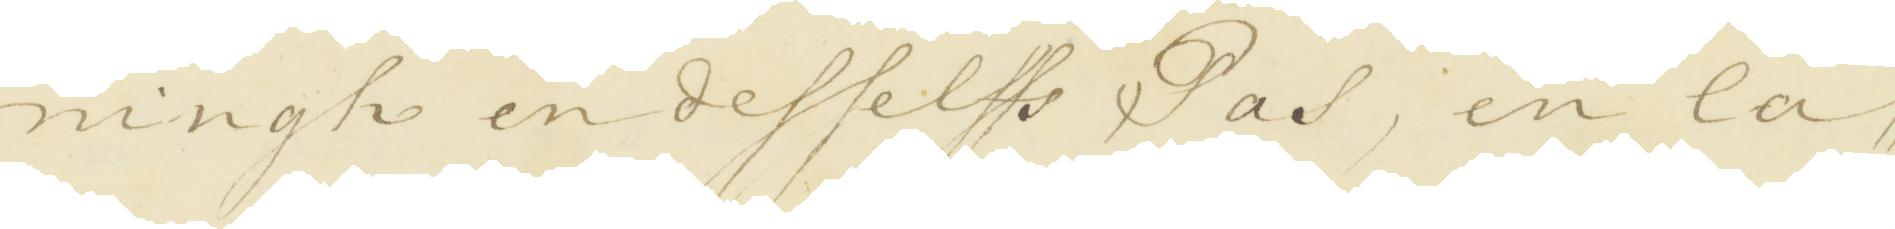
ningh en desselfs Pas; en la„
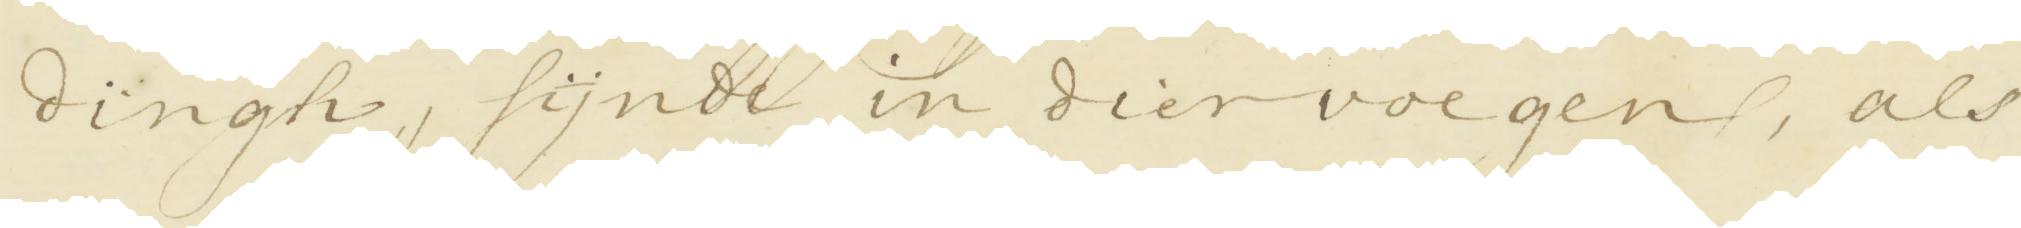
dingh, sijnde in dier voegens, als
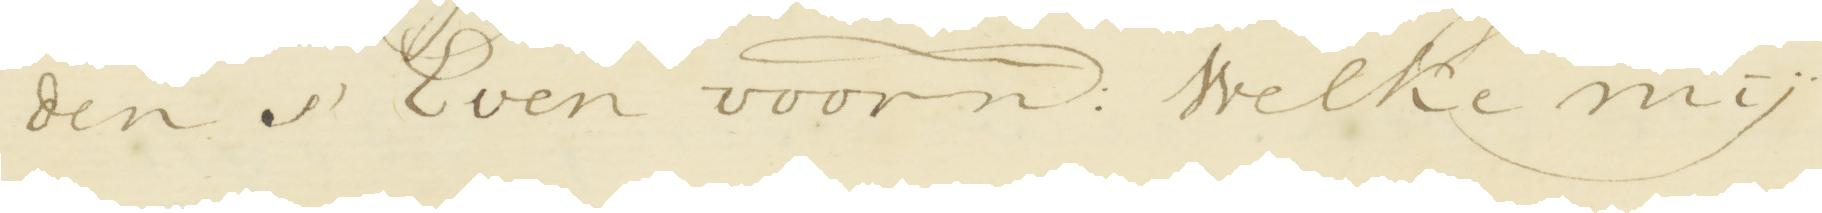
den s' Even voorn: welke mij
